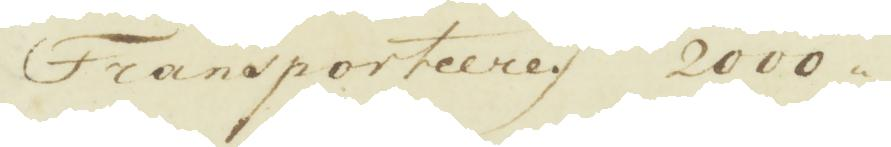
Transporteereƒ 2000 „
